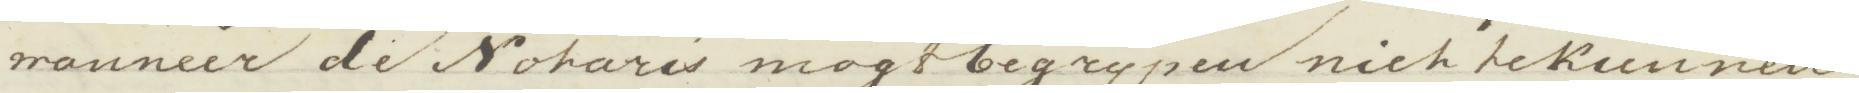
wanneer de Notaris mogt begrypen niet te kunnen
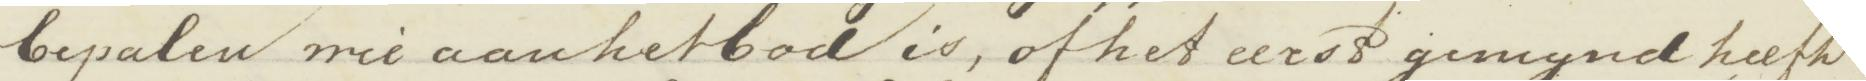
bepalen wie aan het bod is, of het eerst gemynd heeft
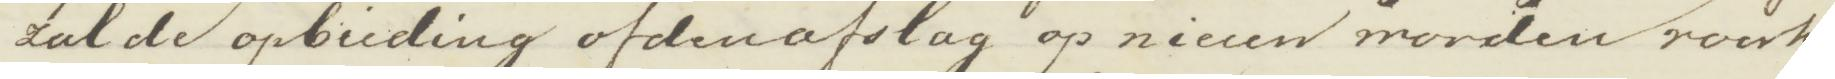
zal de opbieding of den afslag op nieuw worden voort
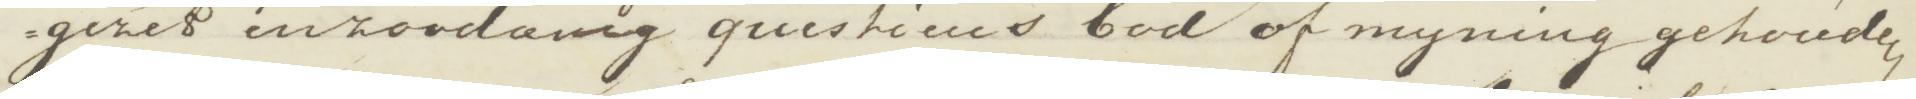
„gezet en zoodanig questieus bod of myning gehouden
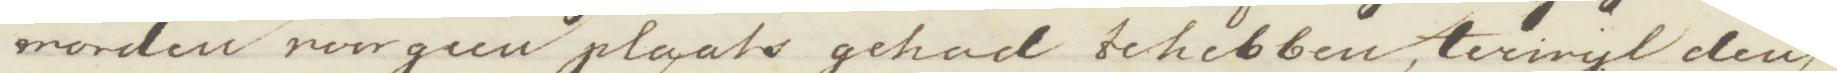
worden voor geen plaats gehad te hebben, terwijl den
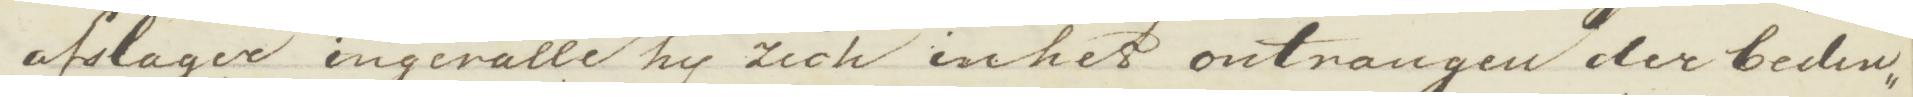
afslager ingevalle hy zich in het ontvangen der bedin„
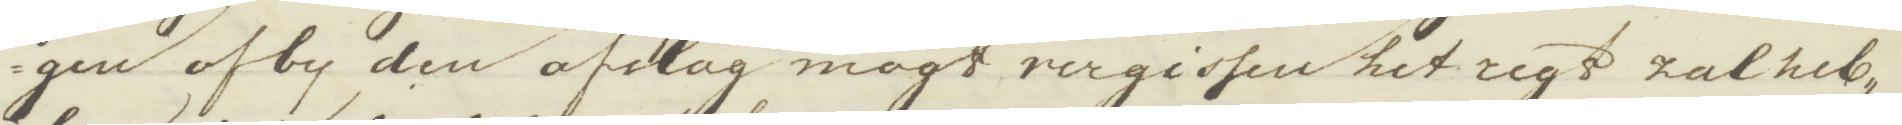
„gen of by den afslag mogt vergissen het regt zal heb„
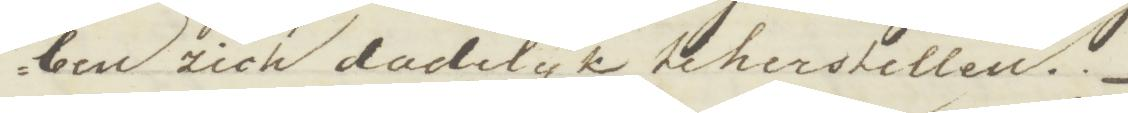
„ben zich dadelyk te herstellen.
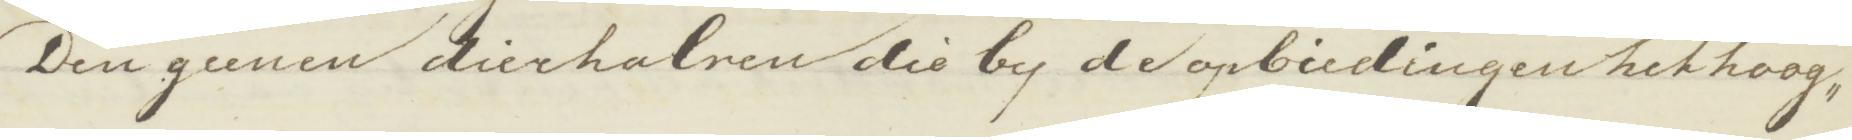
Den geenen dierhalven die by de opbiedingen het hoog„
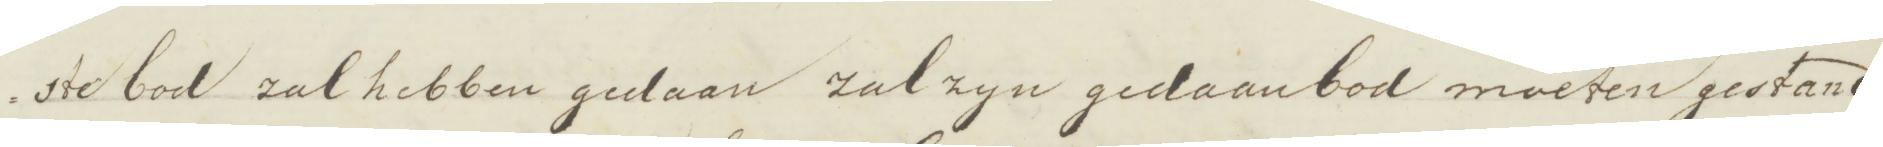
„ste bod zal hebben gedaan zal zyn gedaan bod moeten gestand
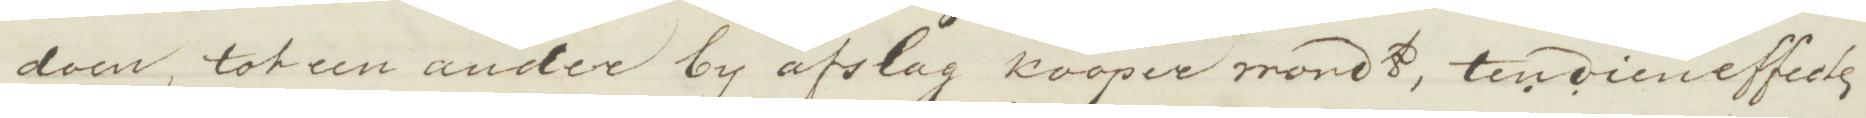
doen, tot een ander by afslag kooper wordt, ten dien effecten
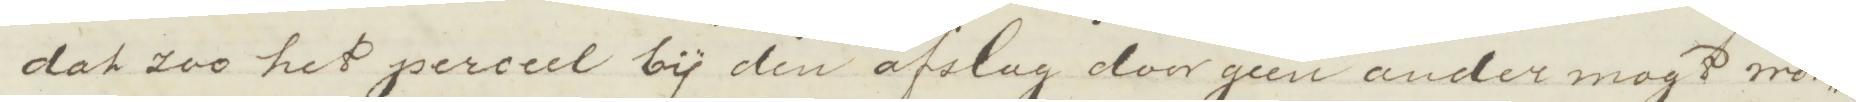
dat zoo het perceel bij den afslag door geen ander mogt wor„
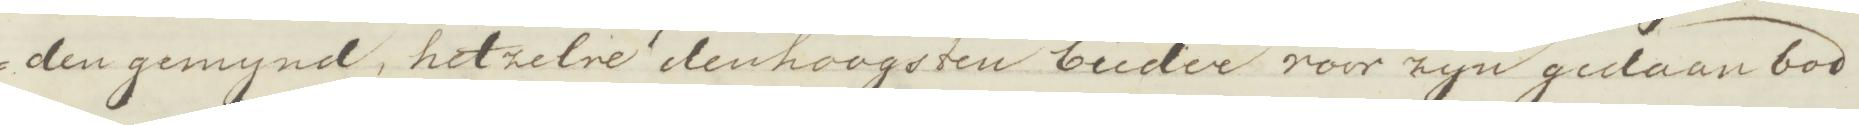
den gemynd, hetzelve den hoogsten bieder voor zyn gedaan bod
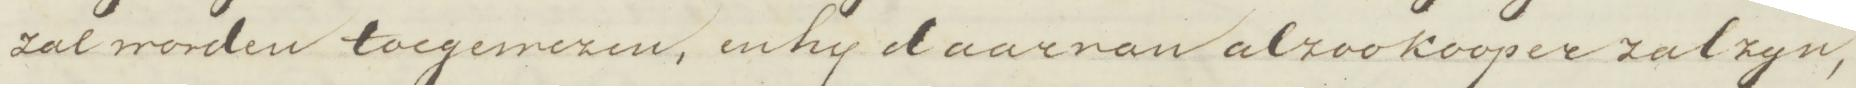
zal worden toegewezen, en hy daarvan alzoo kooper zal zyn,
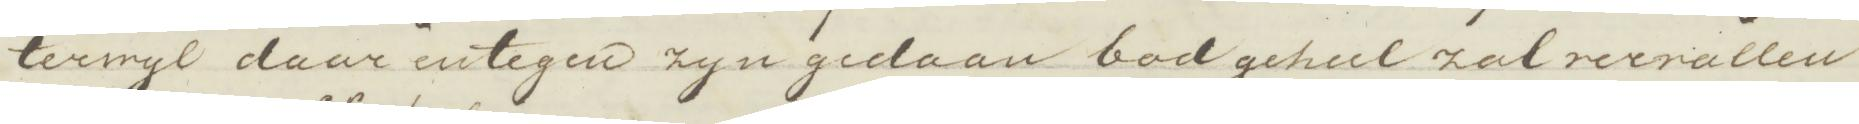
terwyl daar en tegen zyn gedaan bod geheel zal vervallen
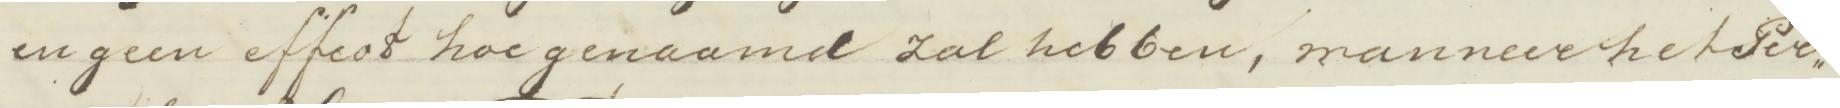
en geen effect hoe genaamd zal hebben, wanneer het Per„
